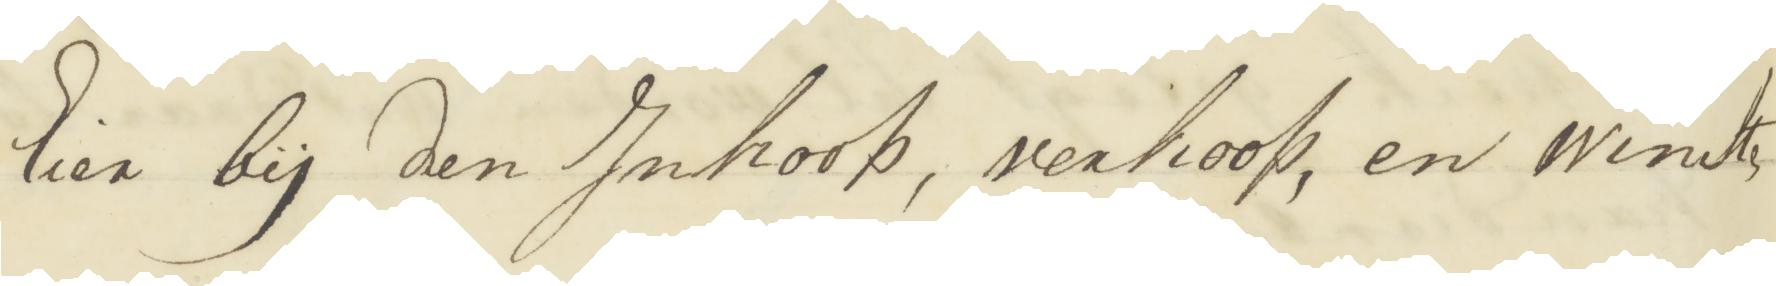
hier bij den Jnkoop, verkoop, en winsten
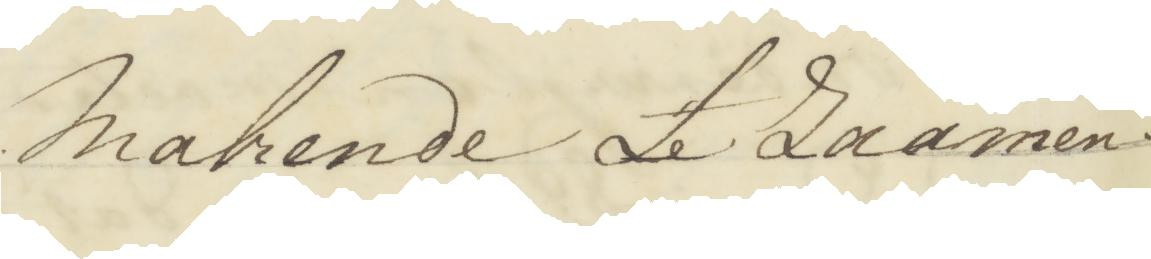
makende te zaamen
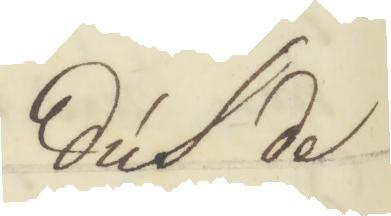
dus de
